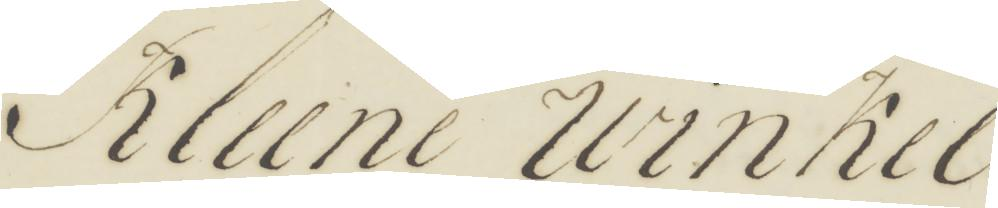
Kleene winkel
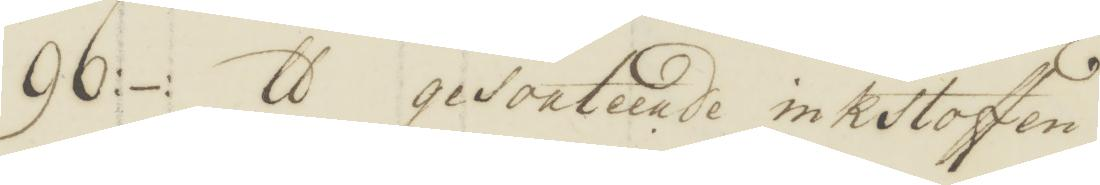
96:—: lb gesorteerde inkstoffen
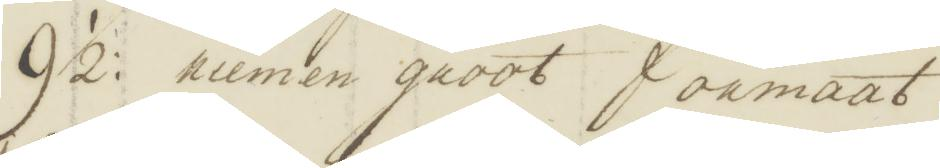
9½: riemen groot formaat
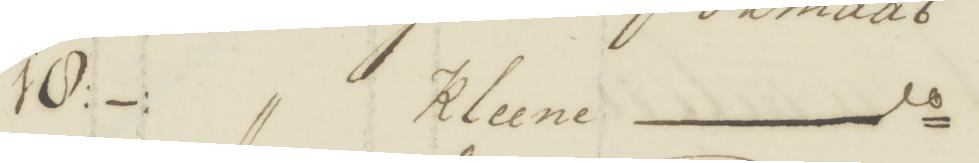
18:—: Kleene _=o
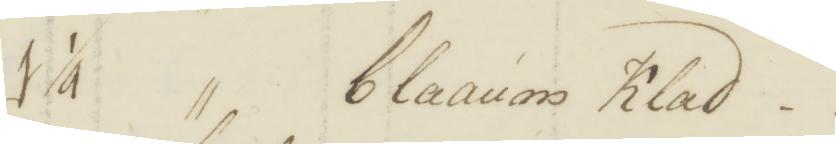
1¼ „ blaauw klad .
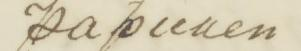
papieren
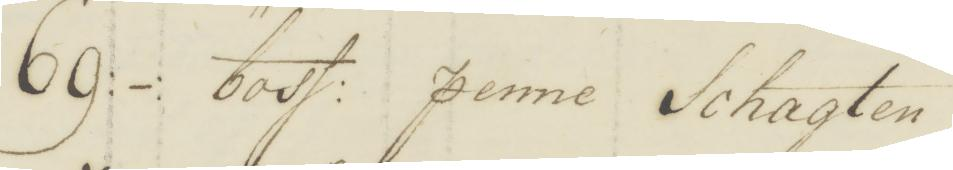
69:–: boss: penne schagten
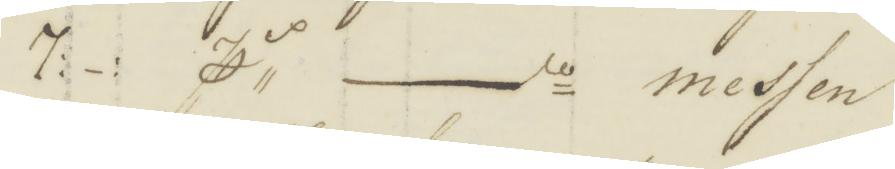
7:-: p:s _=o messen
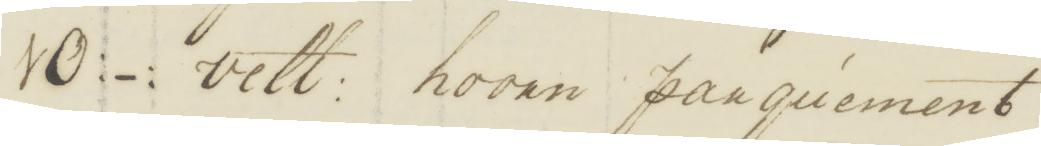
10:-: velt: hoorn parquement
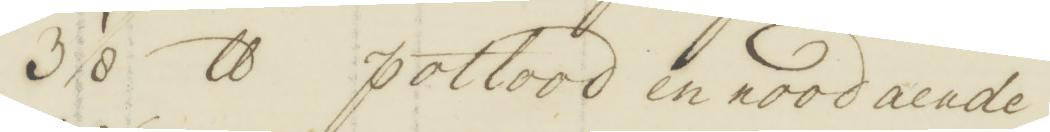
3 1/8 lb potlood en roodaerde
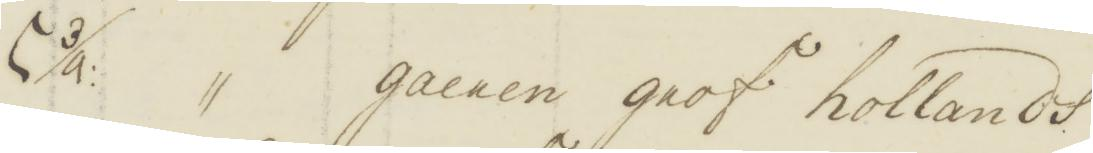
5¾ „ gaeren grof hollands
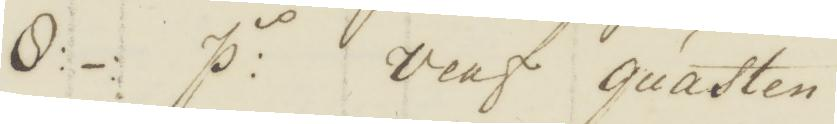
8:-: p:s verf quasten
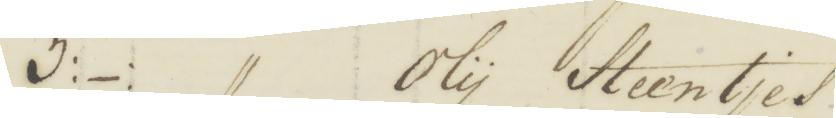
3:-: „ olij steentjes
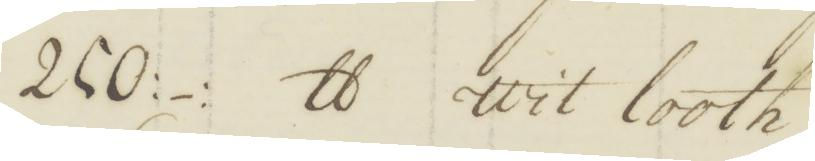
250:-: lb wit looth
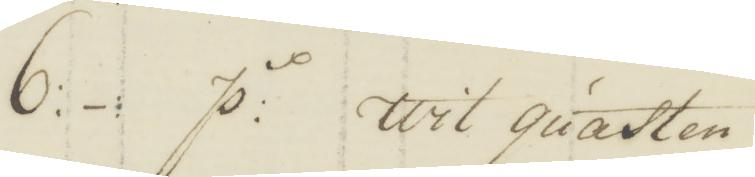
6:—: p:s wit quasten
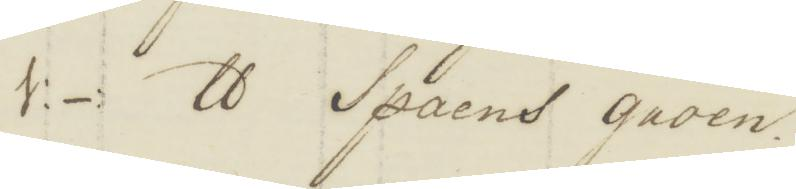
1:–: lb spaens groen.
